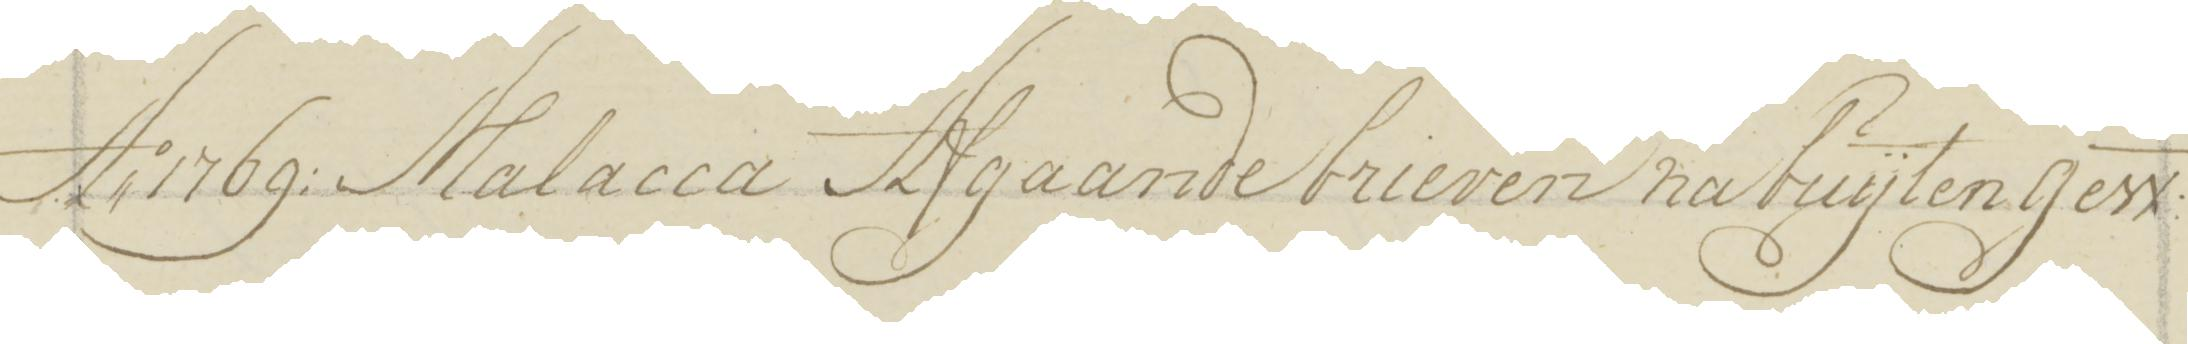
A„o 1769: Malacca Afgaande brieven na buijten gew:
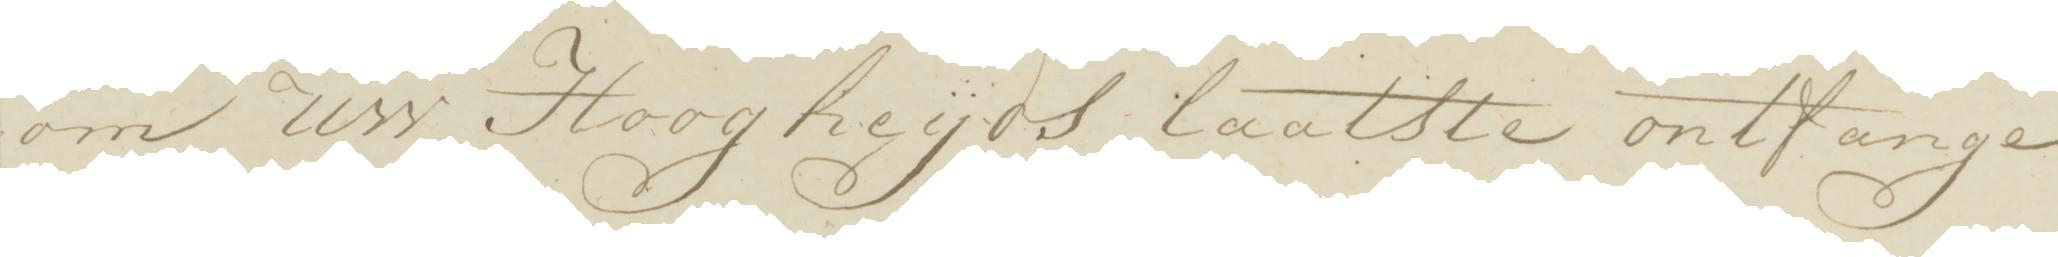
om uw Hoogheijds laatste ontfange
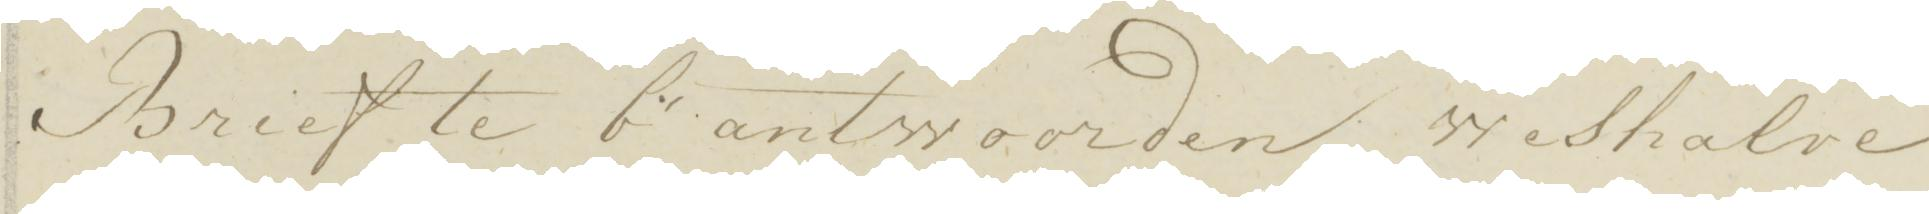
Brief te b'antwoorden, weshalve
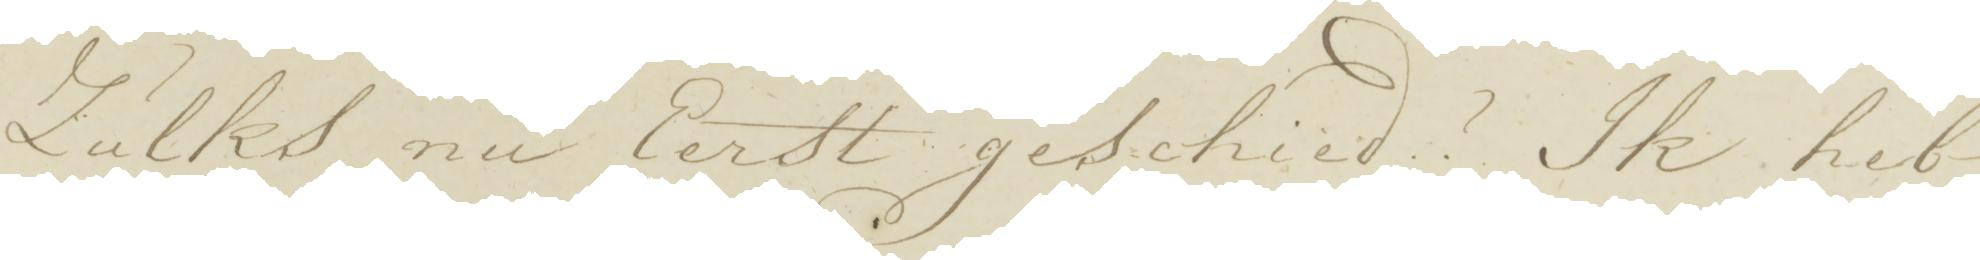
zulks nu Eerst geschied;? Ik heb
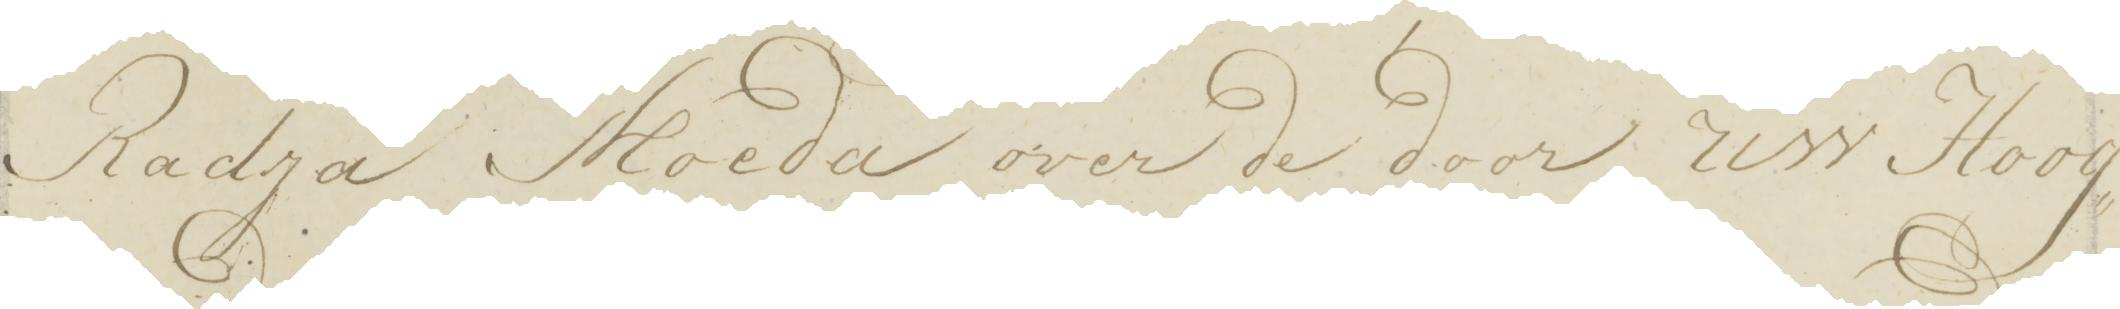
Radja Moeda over de door uw Hoog„
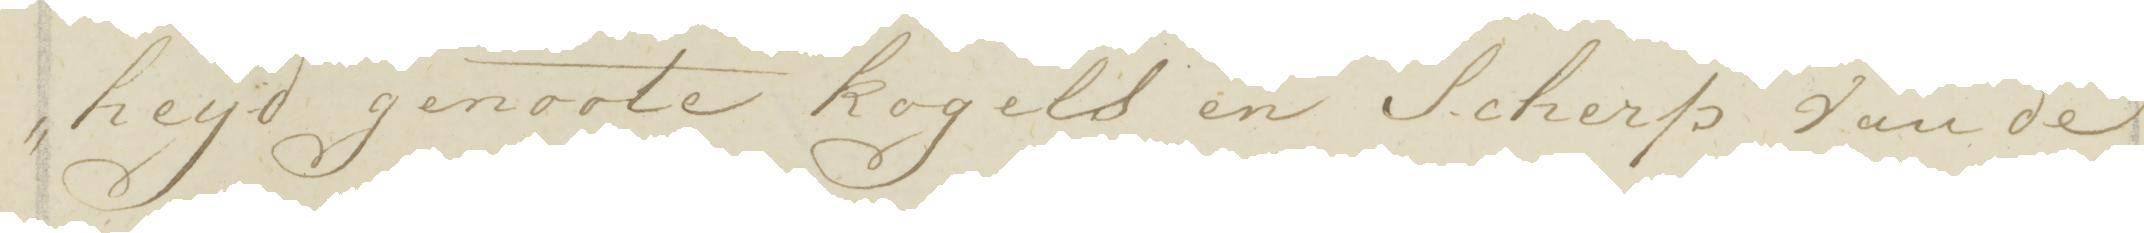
„heijd genoote kogels en scherp van de
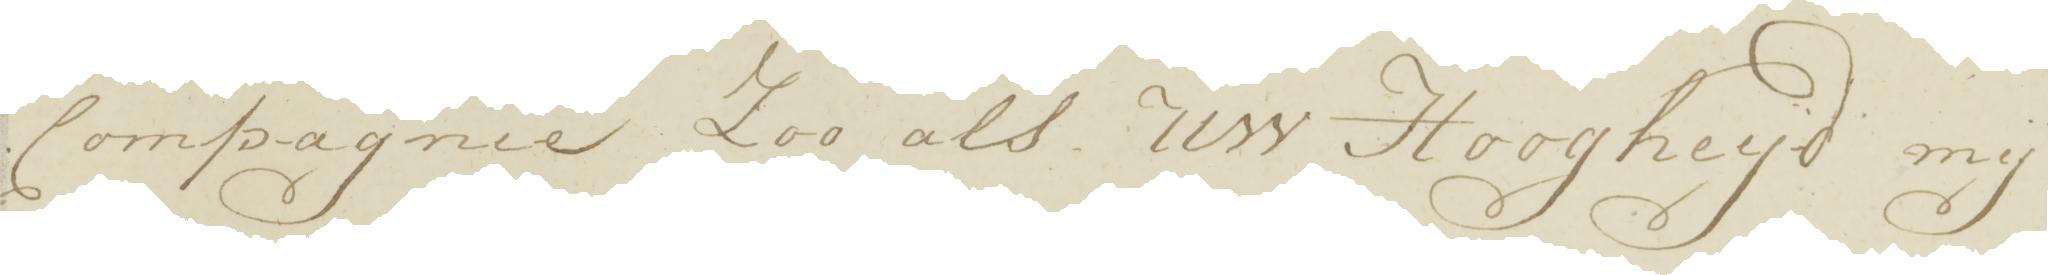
Compagnie zoo als uw Hoogheijd mij
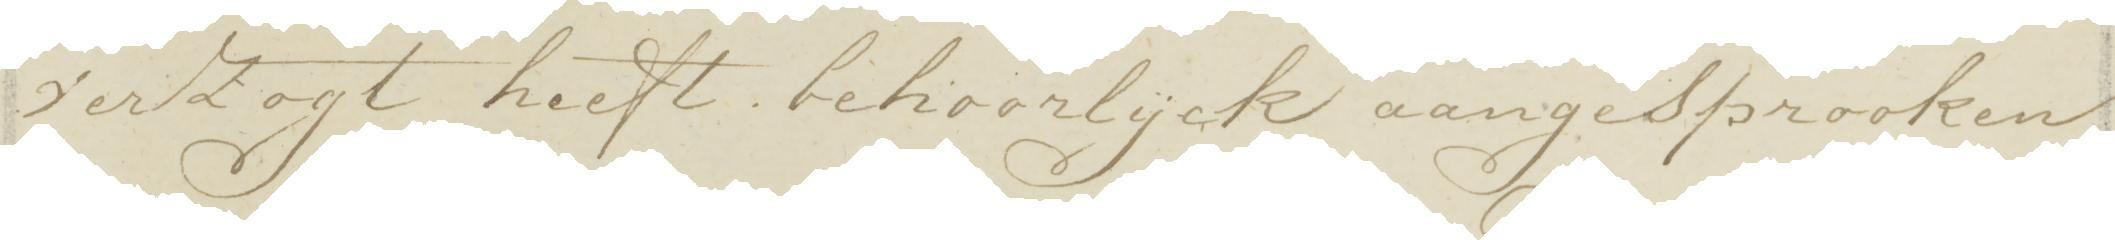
verzogt heeft behoorlijck aangesprooken,
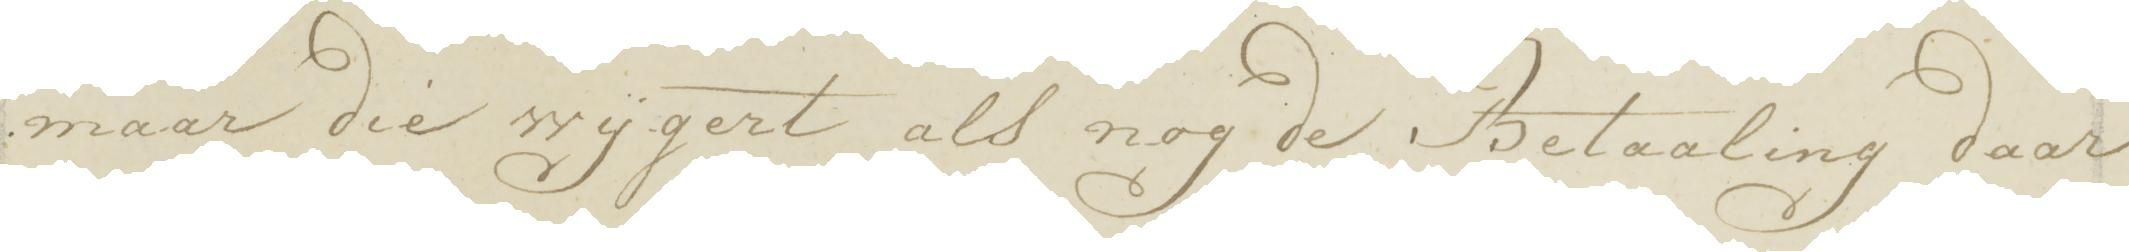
maar die wijgert als nog de Betaaling daar
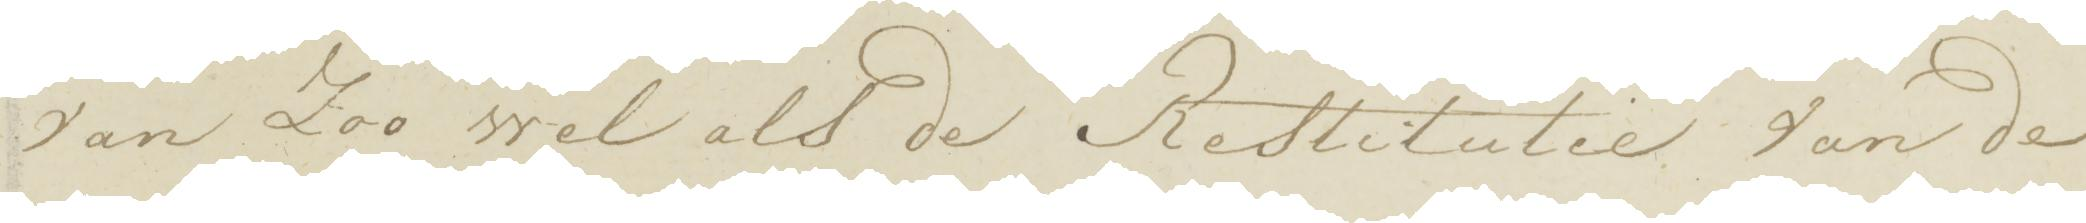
van zoo wel als de Restitutie van de
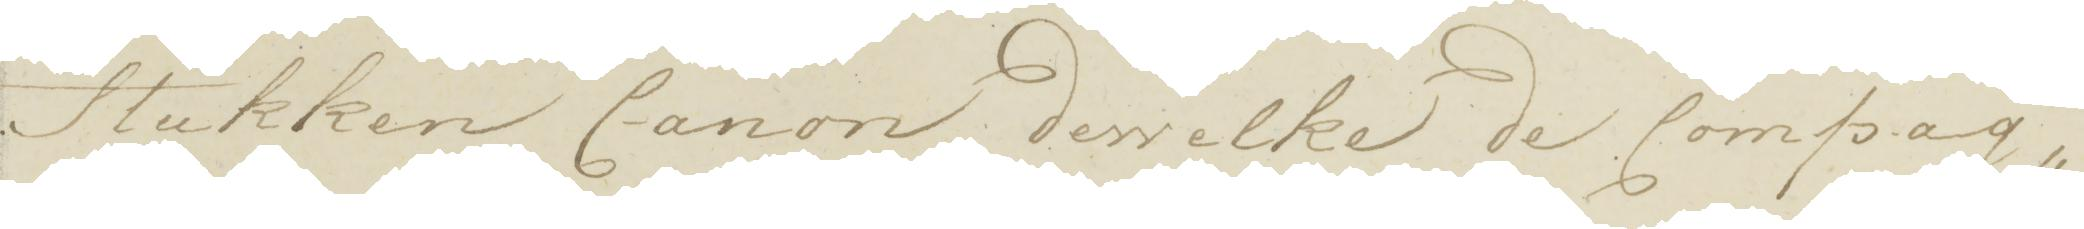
stukken Canon, dewelke de Compag„
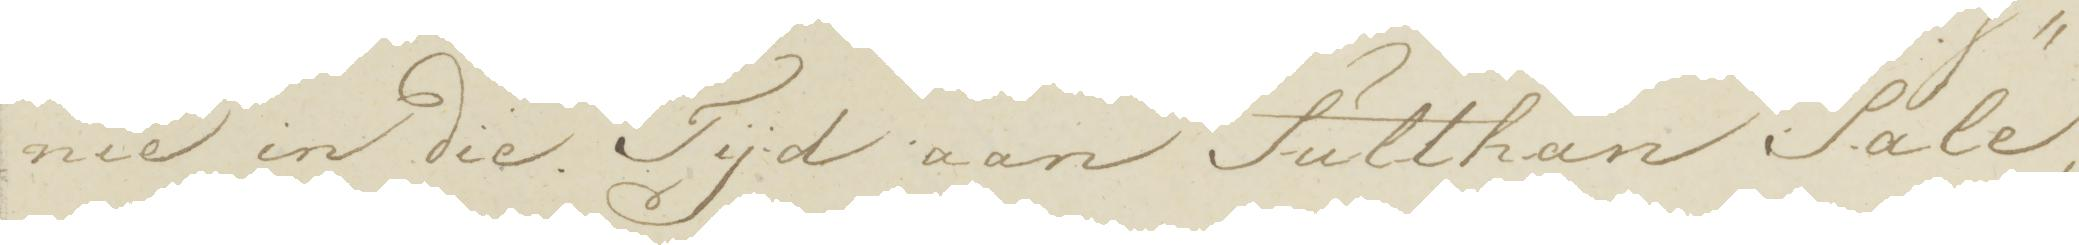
nie in die Tijd aan sulthan sale
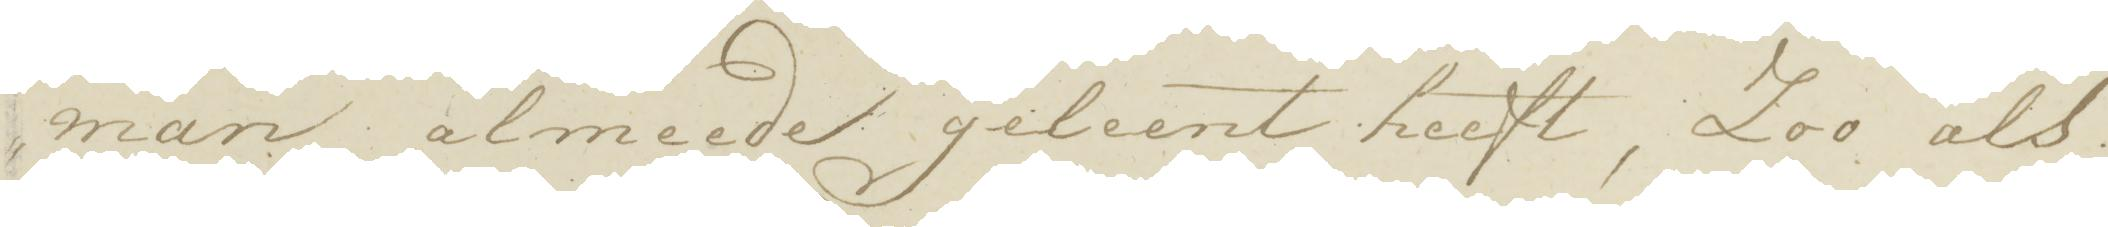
„man, almeede geleent heeft, zoo als
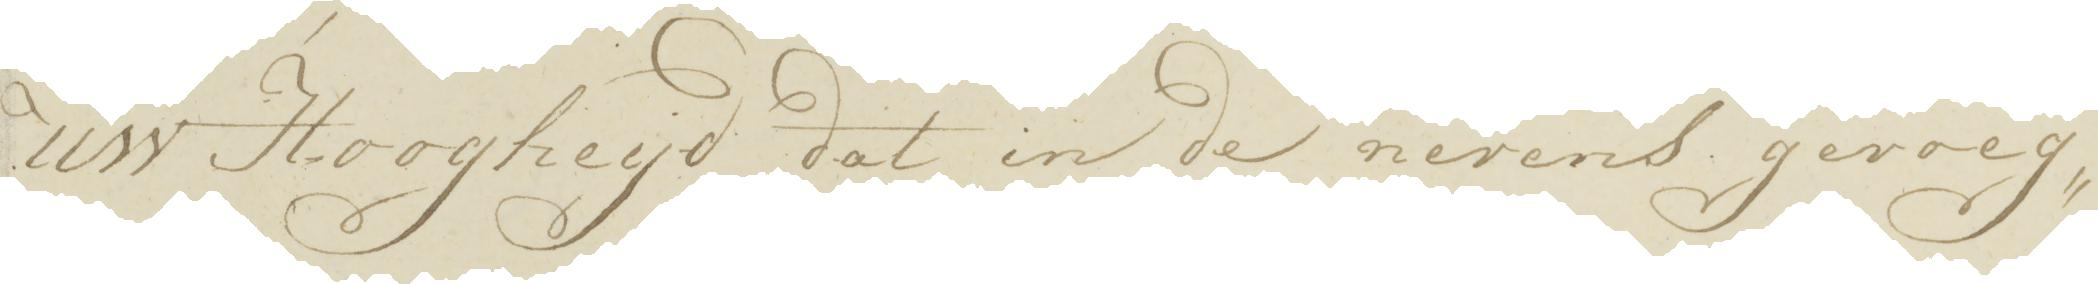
uw Hoogheijd dat in de nevens gevoeg„
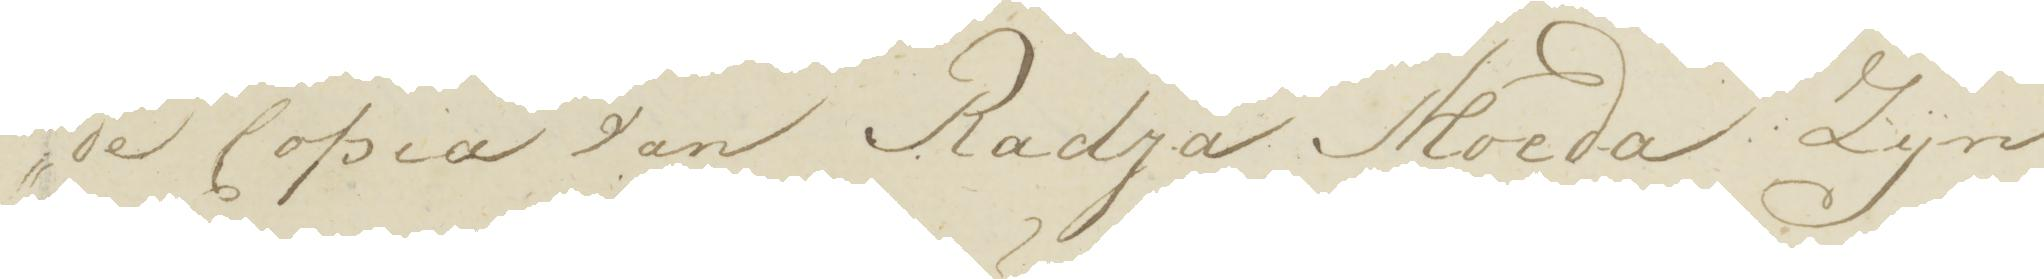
„de Copia van Radja Moeda zijn
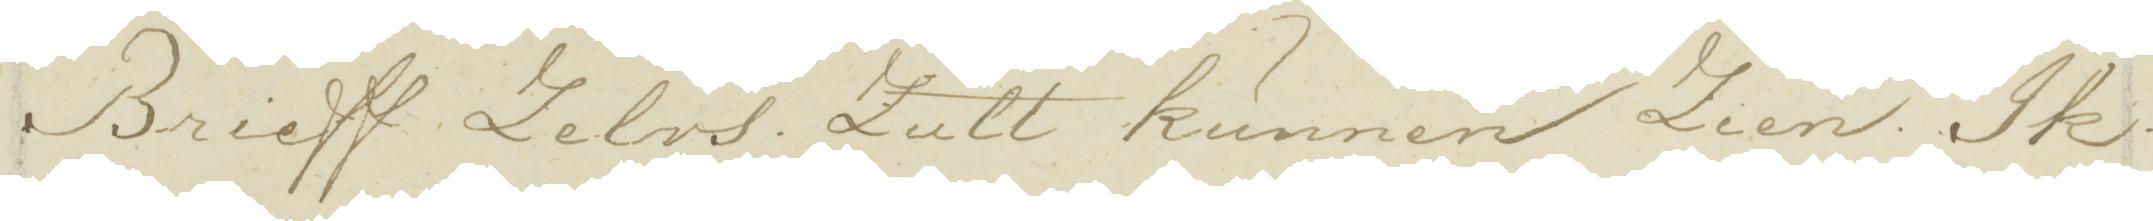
Brieff zelvs zult kunnen zien. Ik
